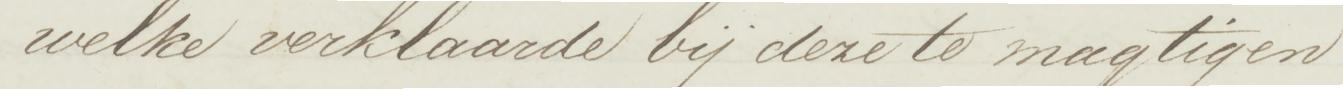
welke verklaarde bij deze te magtigen
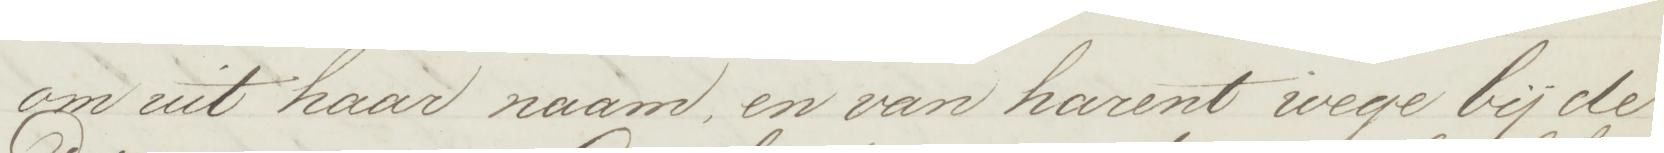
om uit haar naam, en van harent wege bij de
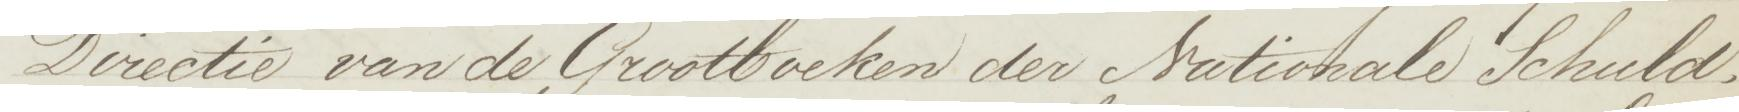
Directie van de Grootboeken der Nationale Schuld,
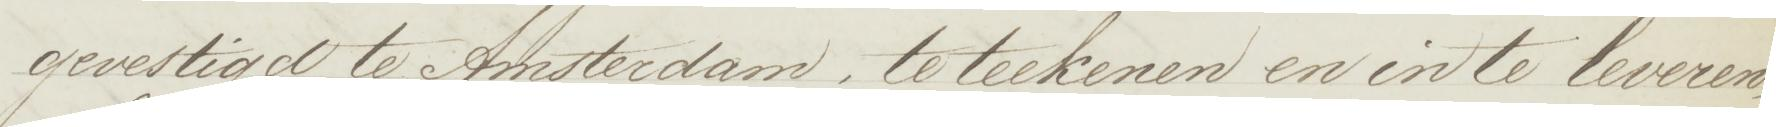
gevestigd te Amsterdam, te teekenen en in te leveren,
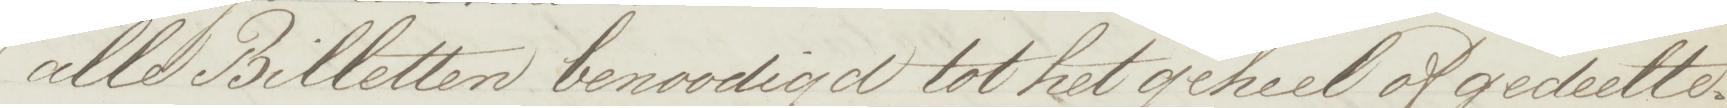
alle Billetten benoodigd tot het geheel of gedeelte„
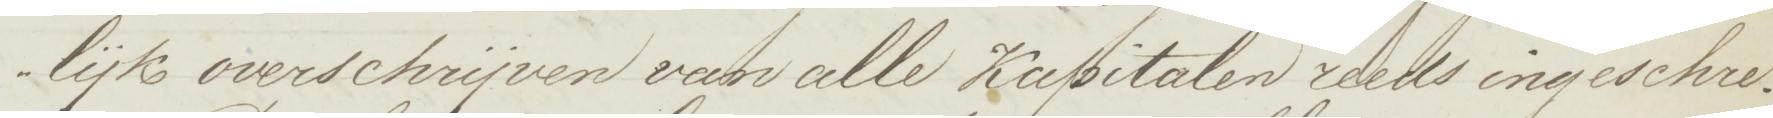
„lijk overschrijven van alle Kapitalen reeds ingeschre„
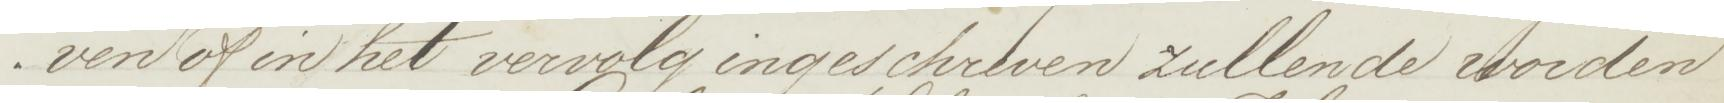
„ven of in het vervolg ingeschreven zullende worden
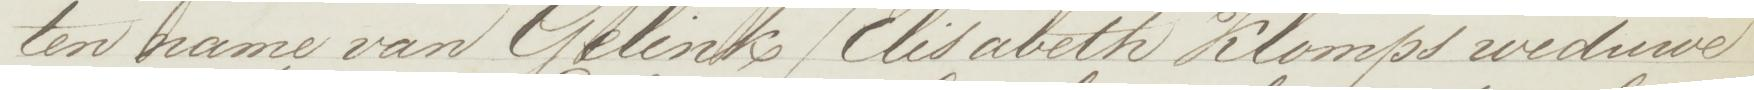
ten name van Gelink / Elisabeth Klomps weduwe
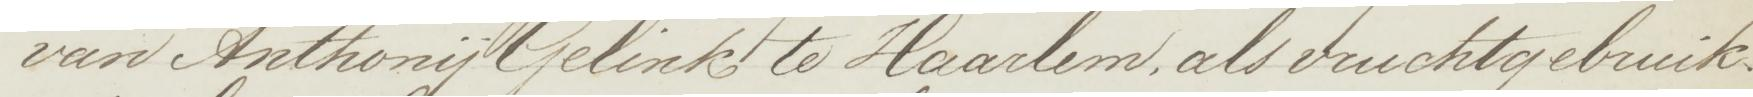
van Anthonij Gelink te Haarlem, als vruchtgebruik„
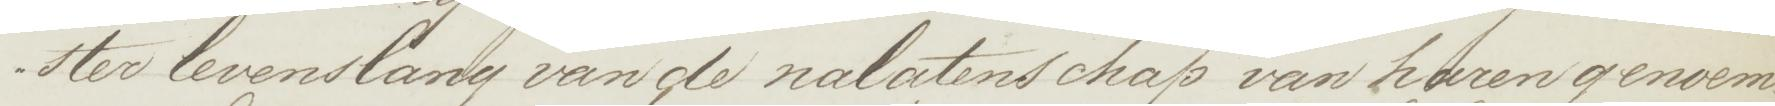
„ster levenslang van de nalatenschap van haren genoem
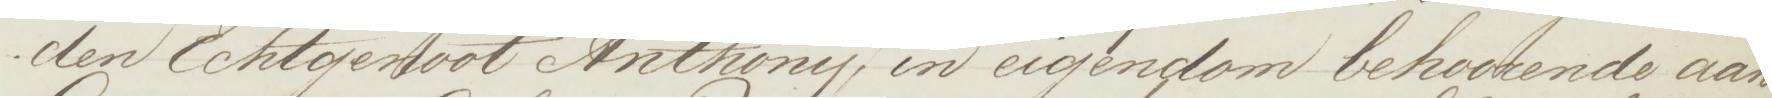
„den Echtgenoot Anthonij, in eigendom behoorende aan
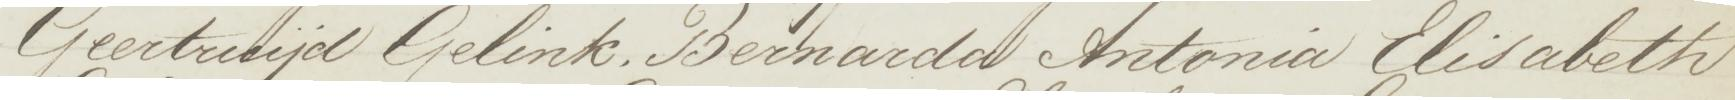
Geertruijd Gelink, Bernarda Antonia Elisabeth
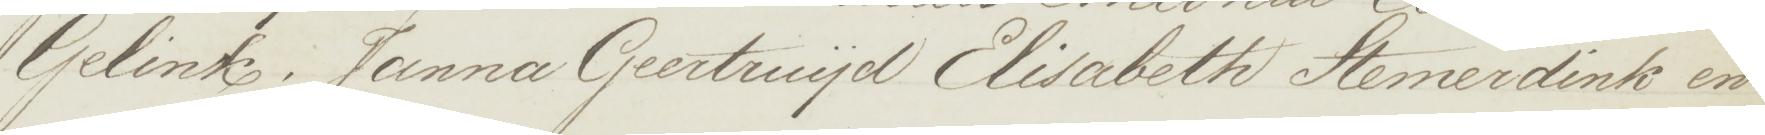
Gelink, Janna Geertruijd Elisabeth Stemerdink en
